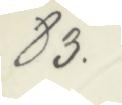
83.
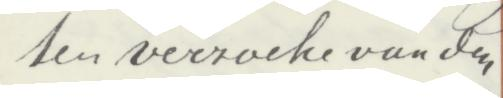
ten verzoeke van den
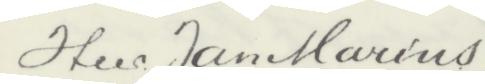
Heer Jan Marius
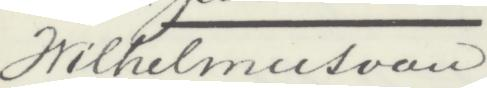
Wilhelmus van
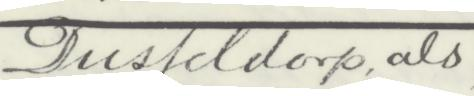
Dusseldorp, als
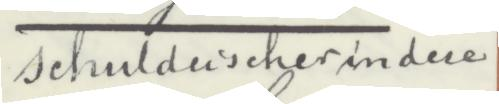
Schuldeischer in deze
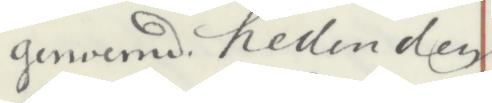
genoemd. heden den
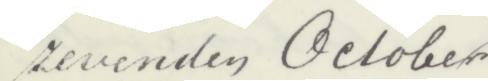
zevenden October
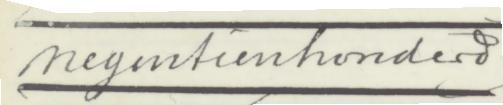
negentienhonderd
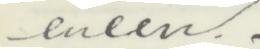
en een.
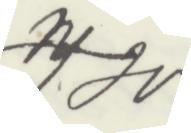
JW
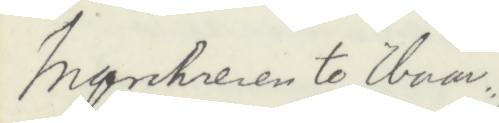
Ingeschreven te Haar„
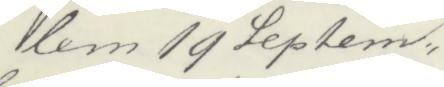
lem 19 septem„
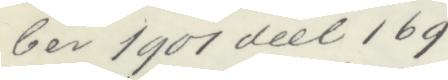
ber 1901 deel 169
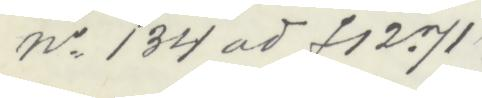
n„o 134 ad f12.71
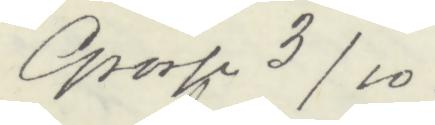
Grosse 3/10
